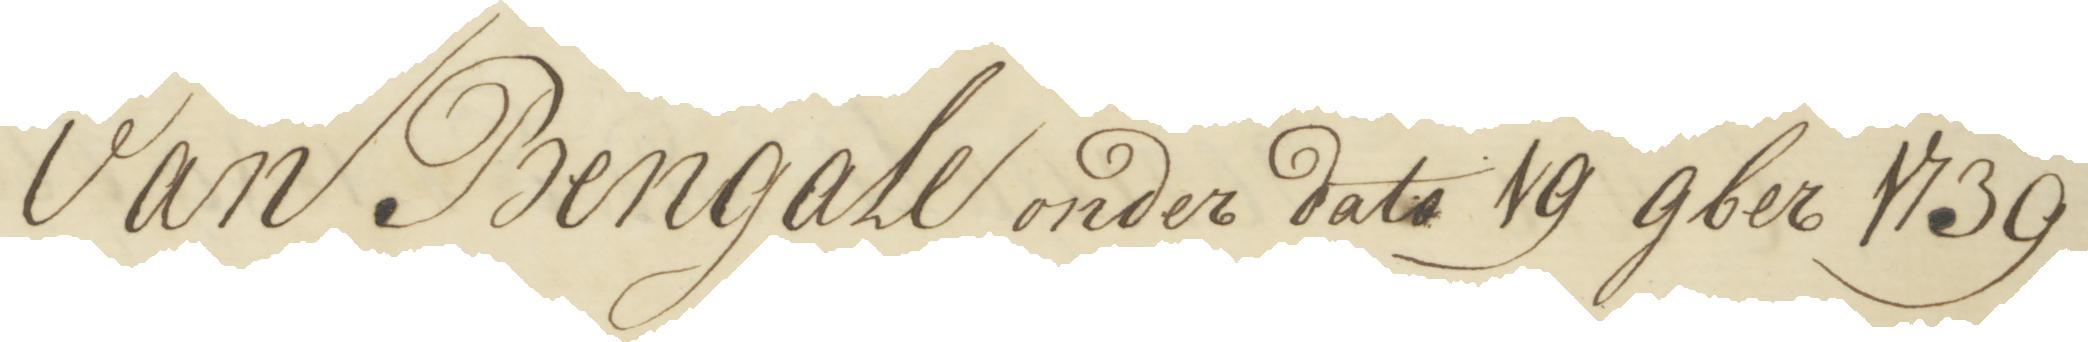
Van Bengale onder dato 19 gber 1739
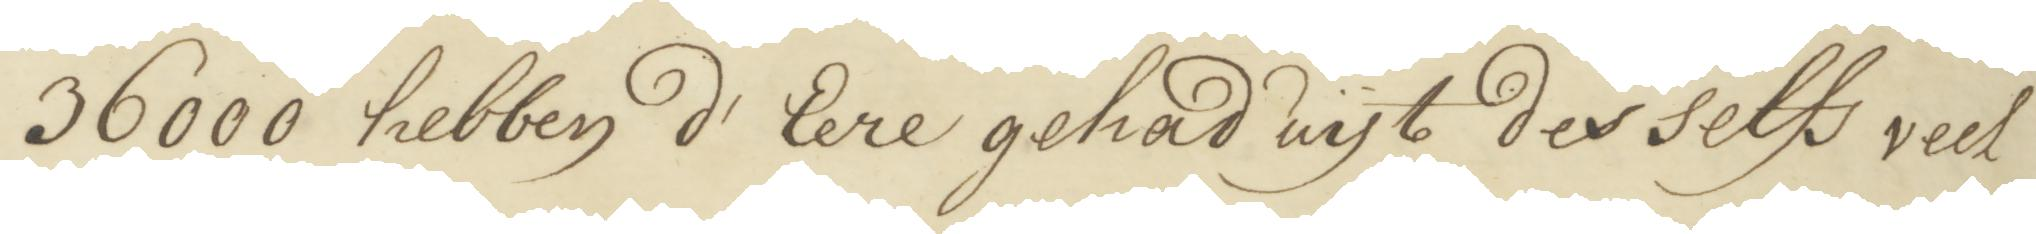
36000 hebben d’ Eere gehad uijt des selfs veel
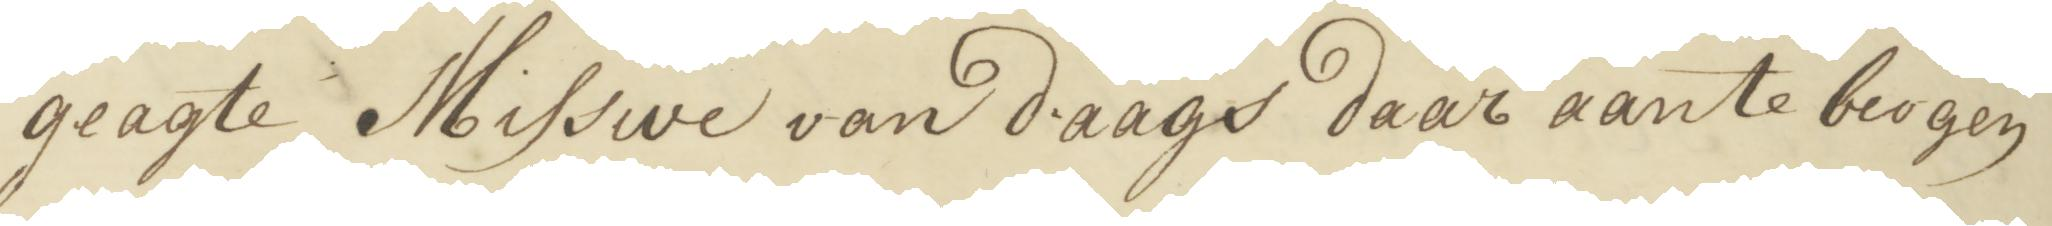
geagte Missive van daags daar aante beogen
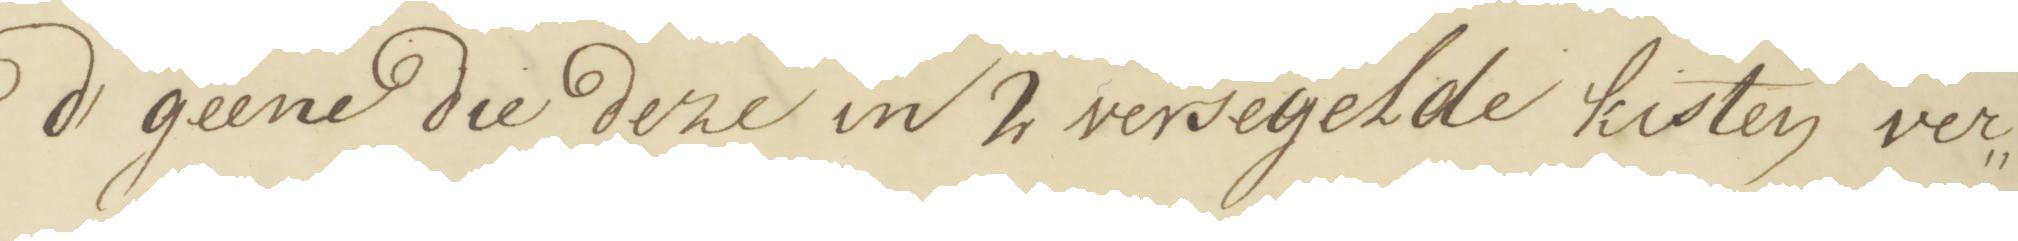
d’ geene die deze in 2 versegelde kisten ver„
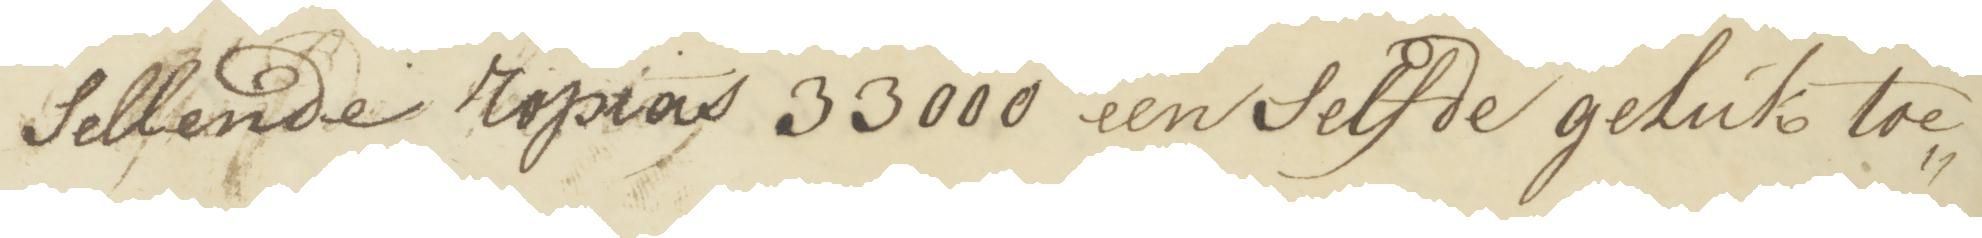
sellende ropias 33000 een selfde geluk toe„
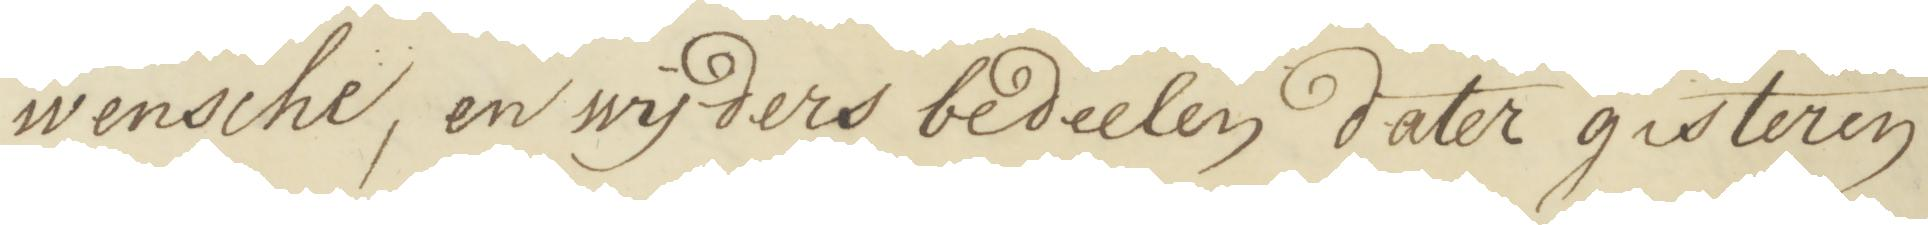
wensche, en wijders bedeelen dater gisteren
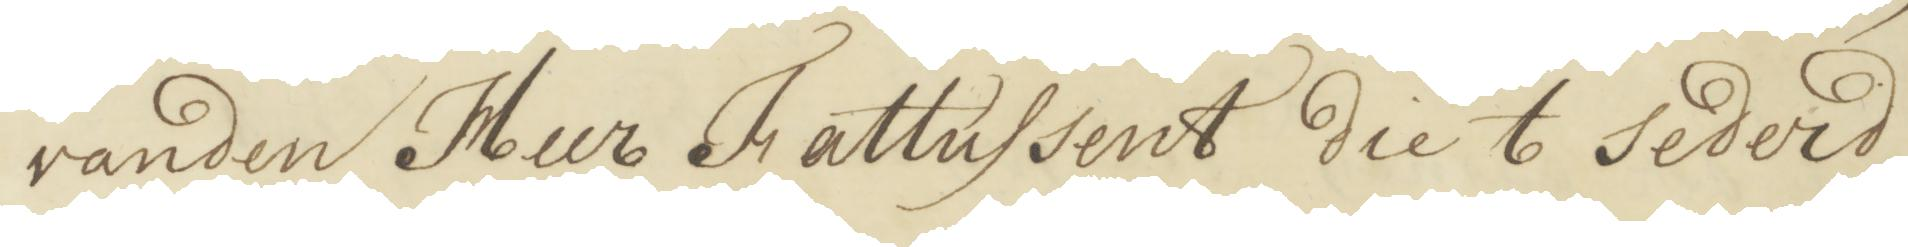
van den Heer Fattussent die t sederd
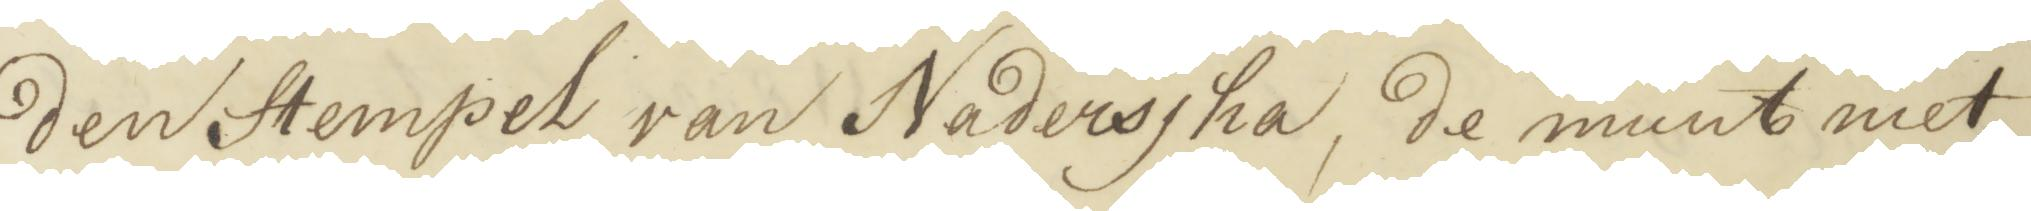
den stempel van Nadersjha, de munt niet
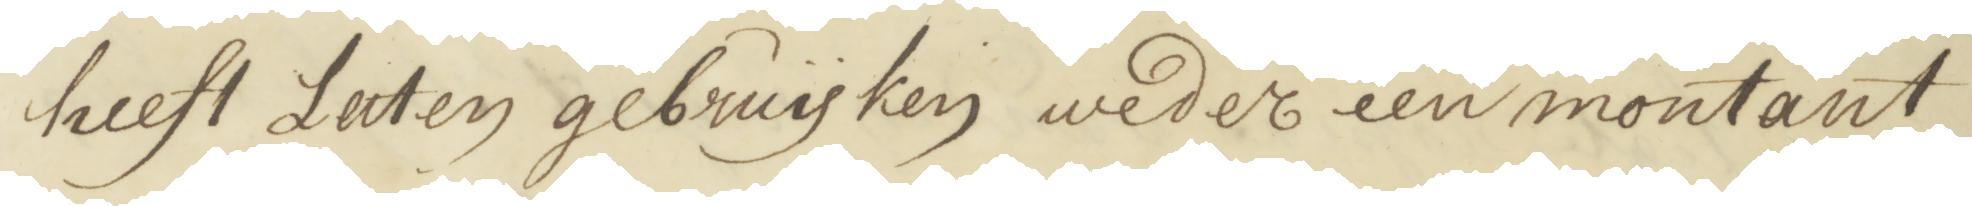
heeft laten gebruijken weder een montant
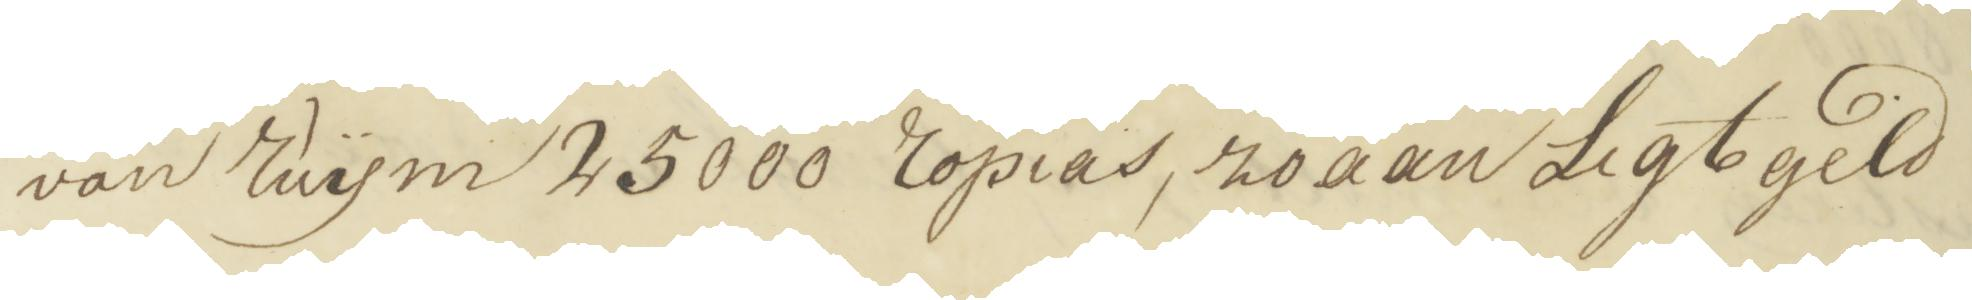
van ruijm 45000 ropias, zo aan ligt geld
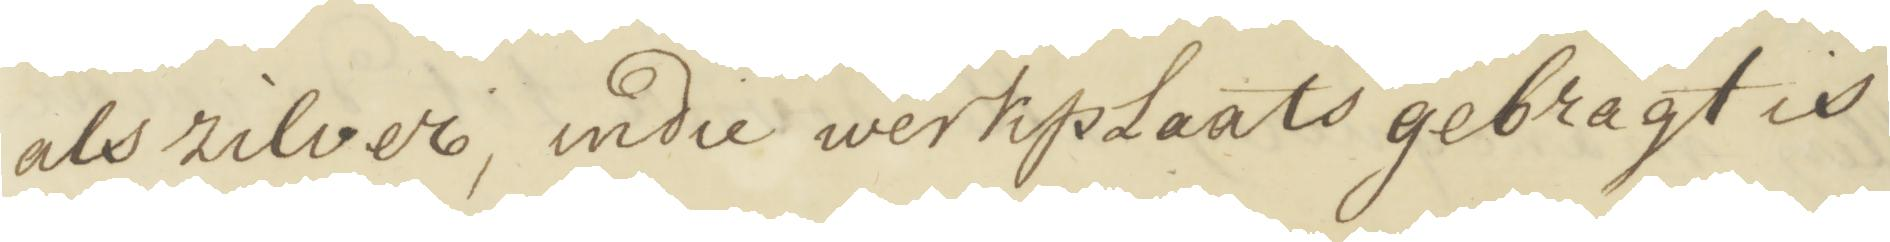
als zilver, indie werkplaats gebragt is
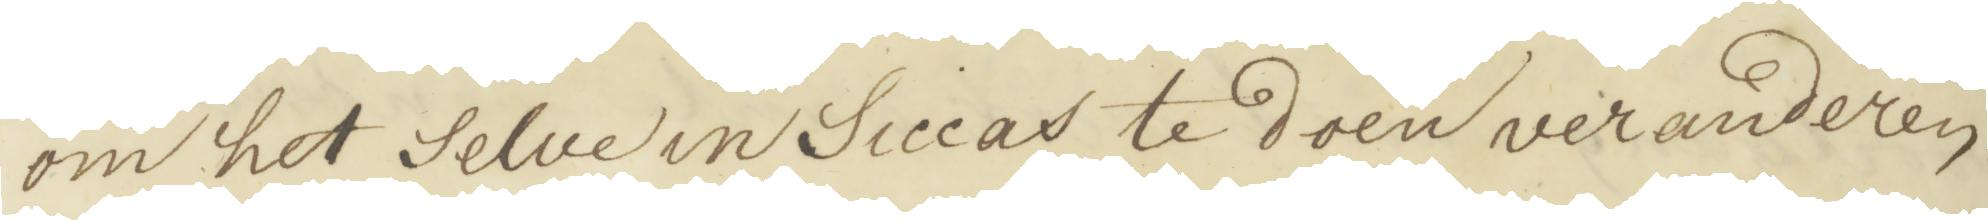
om het selve in siccas te doen veranderen
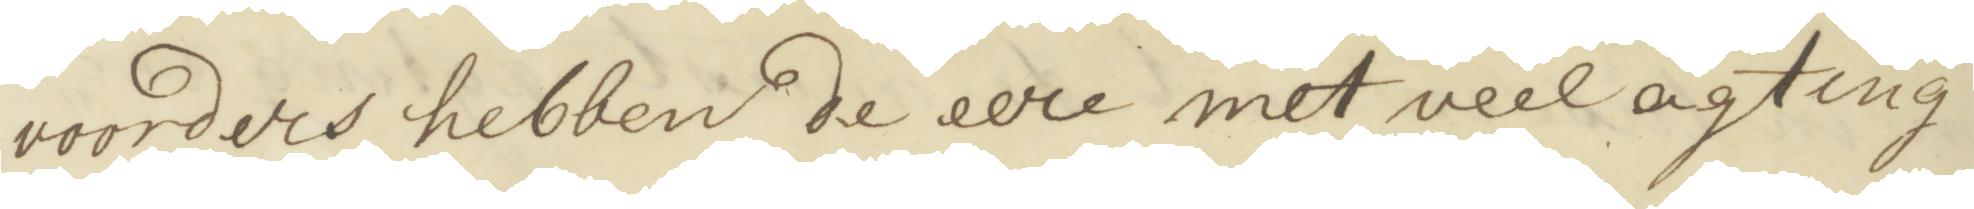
voorders hebben de eere met veel agting
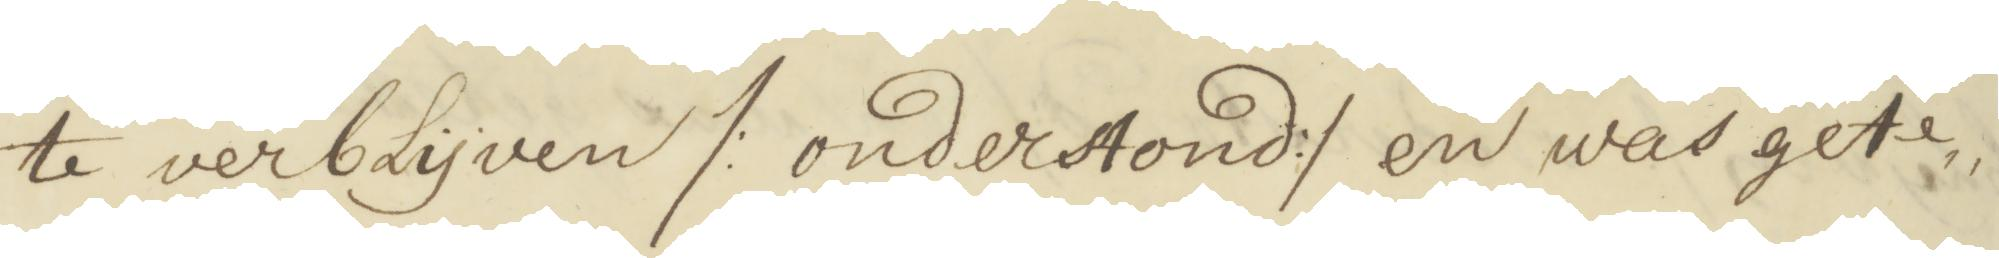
te verblijven /:onderstond:/ en was gete„
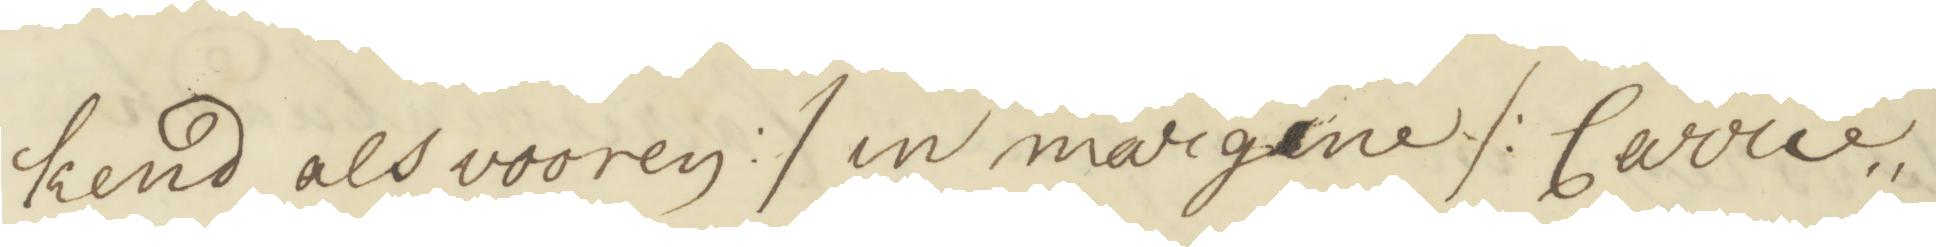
kend als vooren :/ in margine /: Carrie„
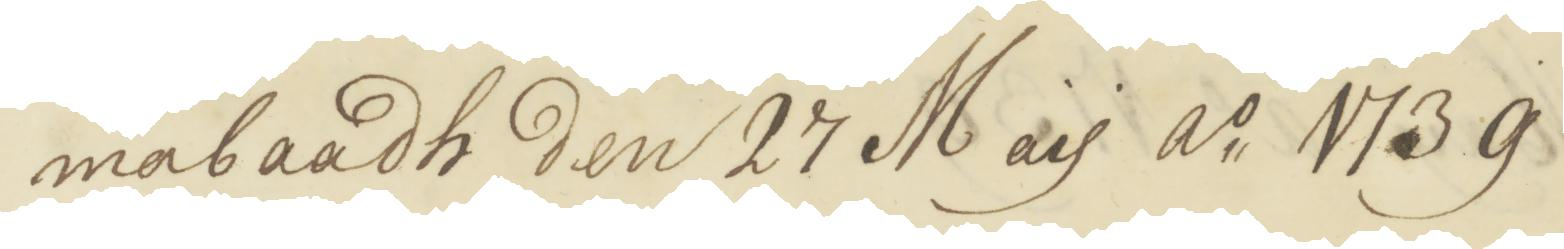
mabaadh den 27 Maij a„o 1739
